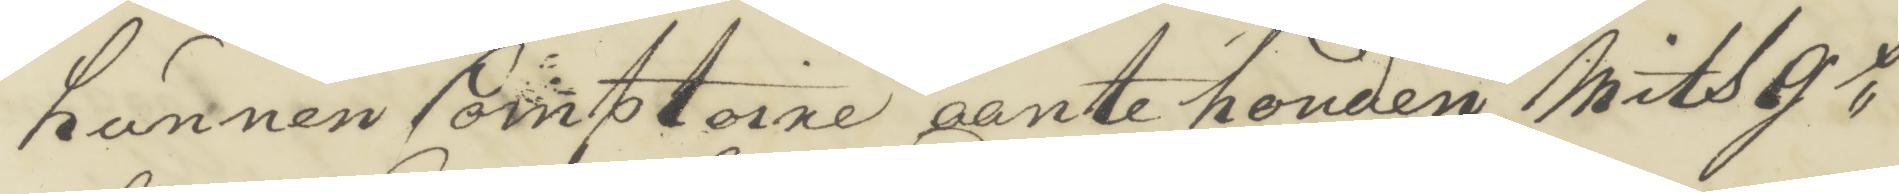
hunnen Comptoire aan te houden mitsg„s
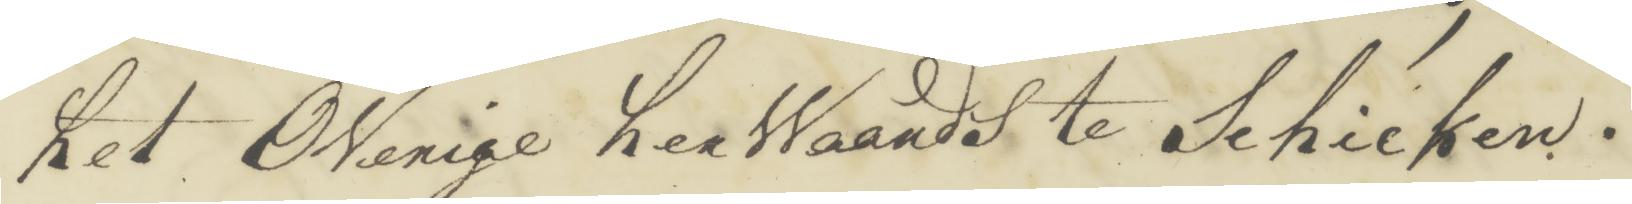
het Overige herwaards te schicken.
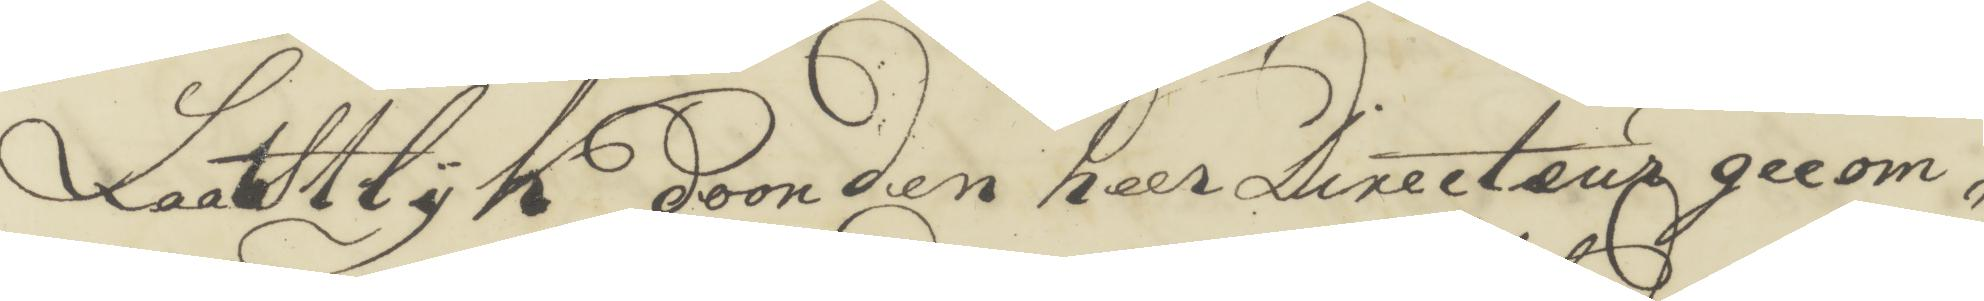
Laastlijk door den heer Directeur gecom
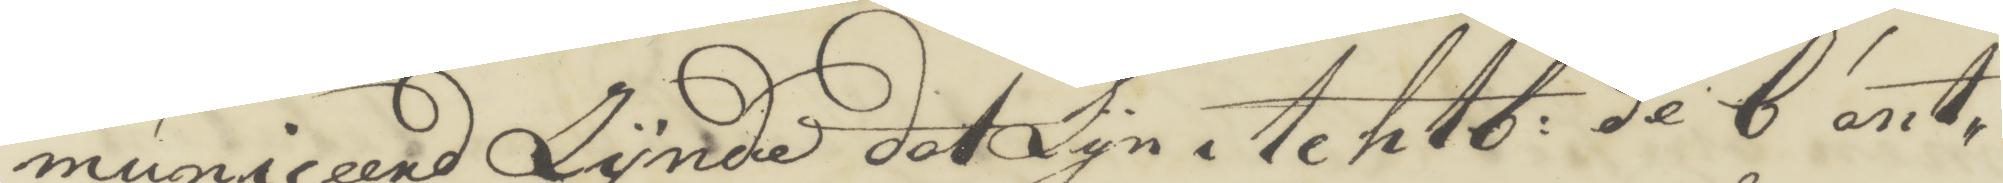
municeerd zijnde dat zijn Achtb: de b'ant„
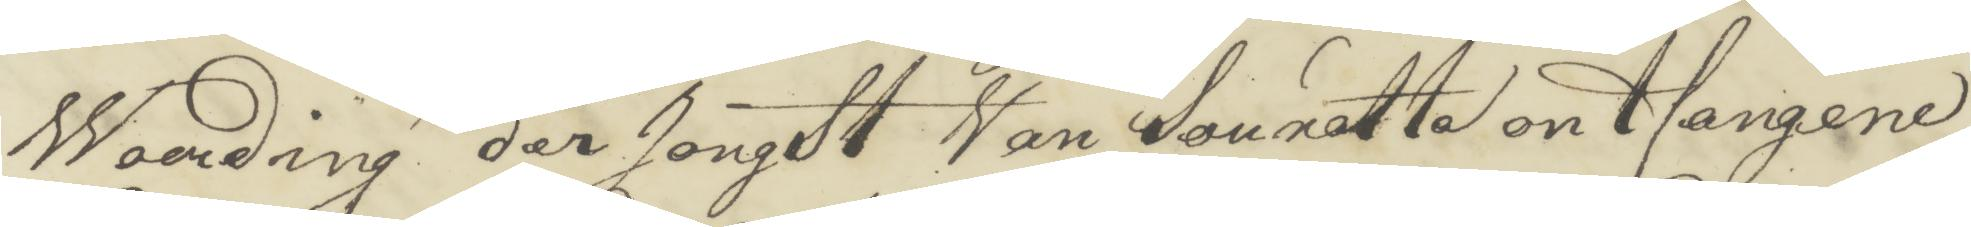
woording der Jongst van Souratta ontfangene
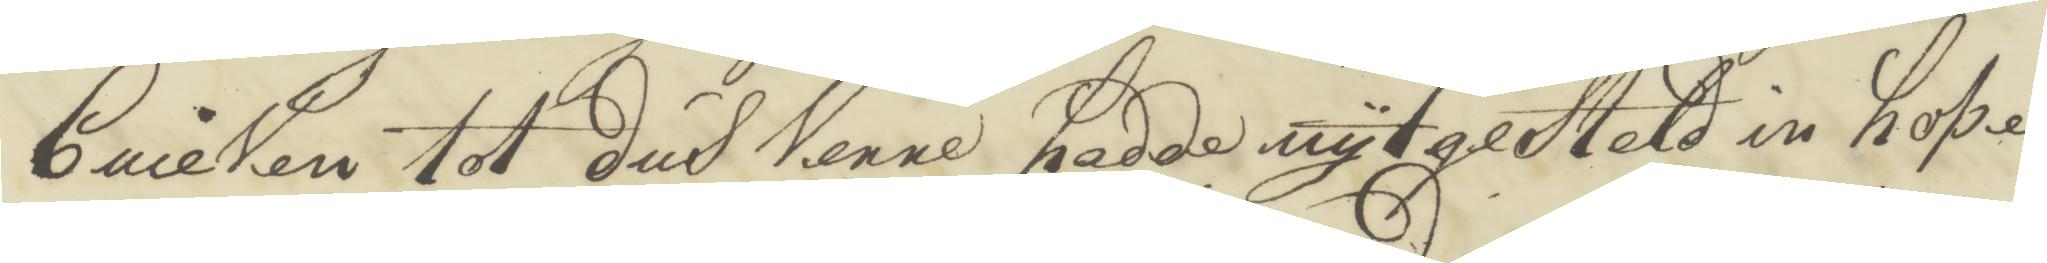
brieven tot dus verre hadde uijtgesteld in hope
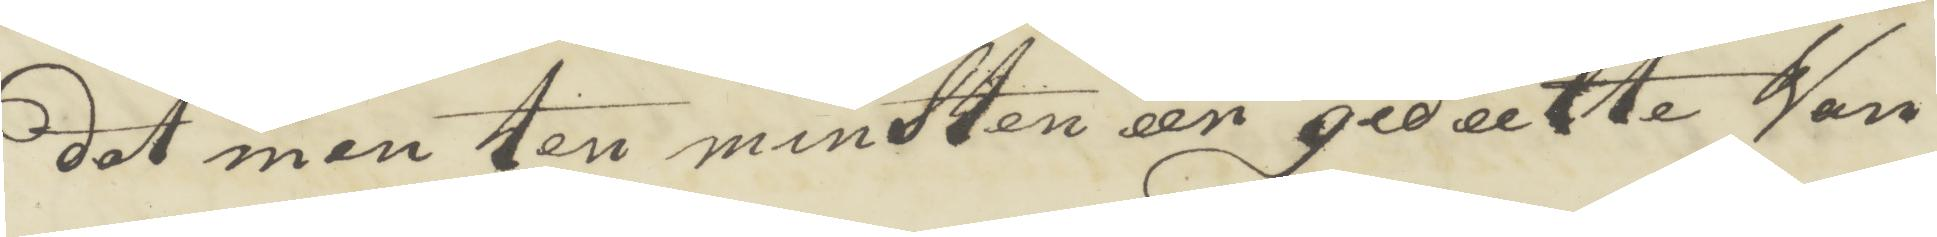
dat men ten minsten een gedeelte van
